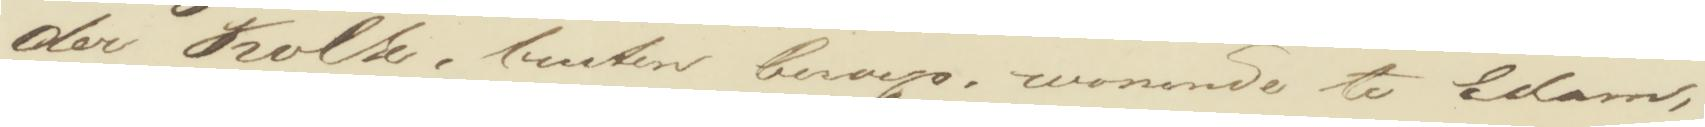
der Kolk, buiten beroep, wonende te Edam,
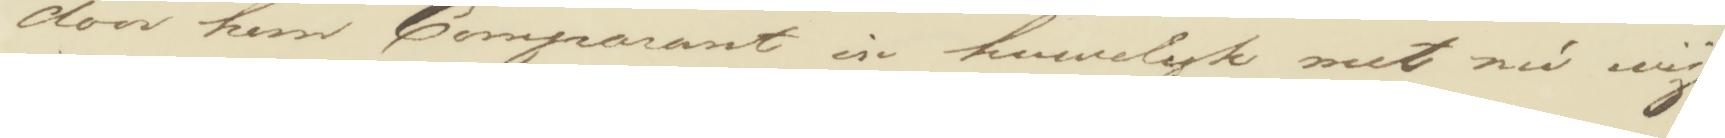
door hem Comparant in huwelyk met nu wij
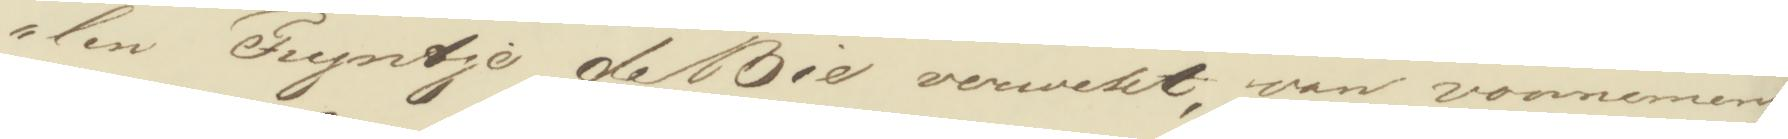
„len Tryntje de Bie verwekt, van voornemen
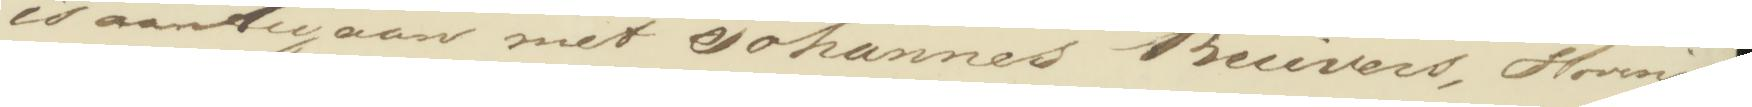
is aantegaan met Iohannes Buivers, Hovenier,
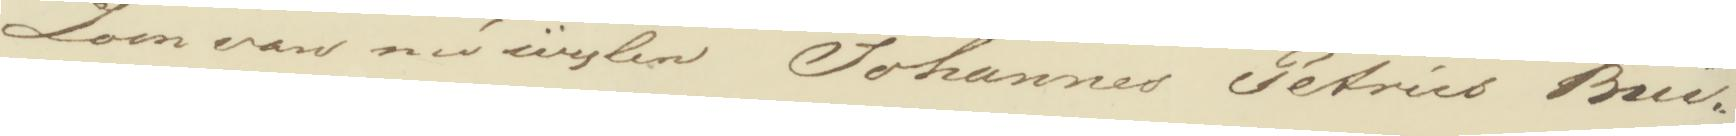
Zoon van nu wijlen Iohannes Petrus Bui„
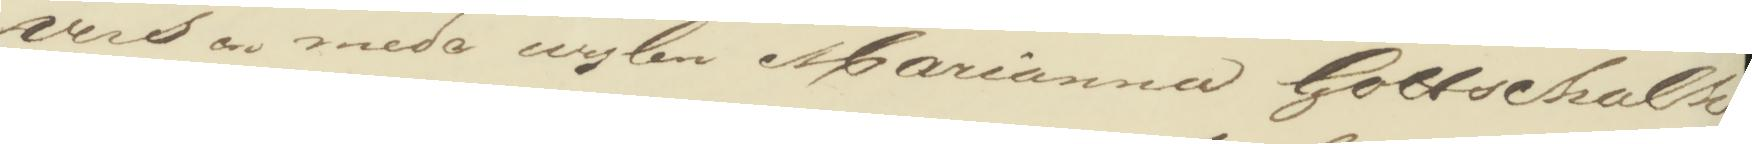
vers en mede wylen Marianna Gottschalk,
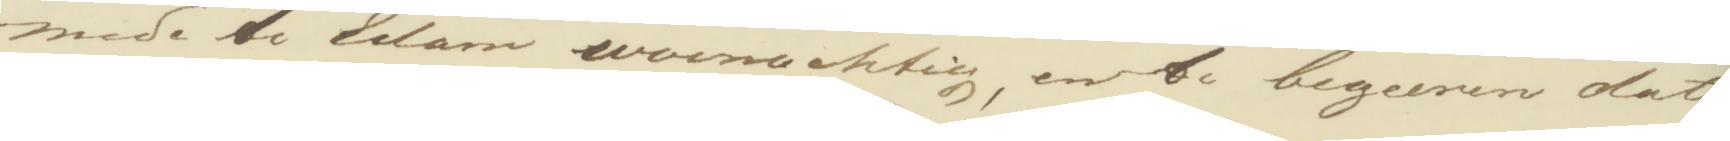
mede te Edam woonachtig, en te begeeren dat
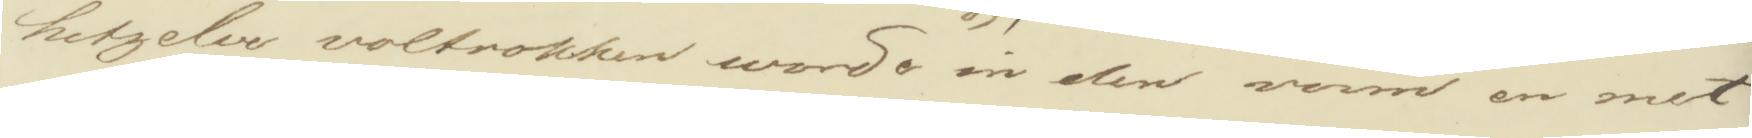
hetzelve voltrokken worde in den vorm en met
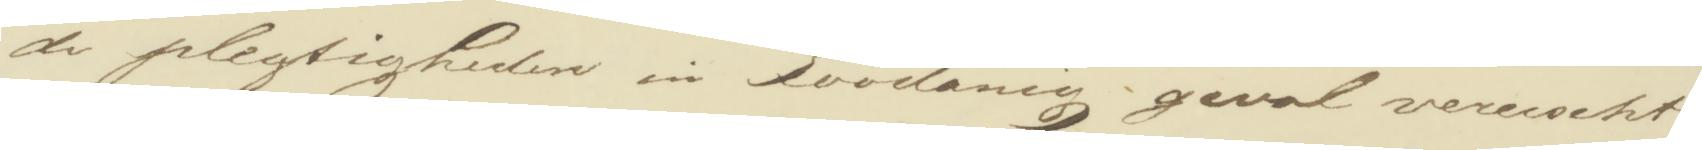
de plegtigheden in zoodanig geval vereischt
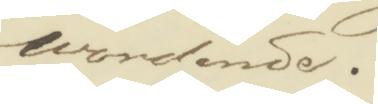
wordende.
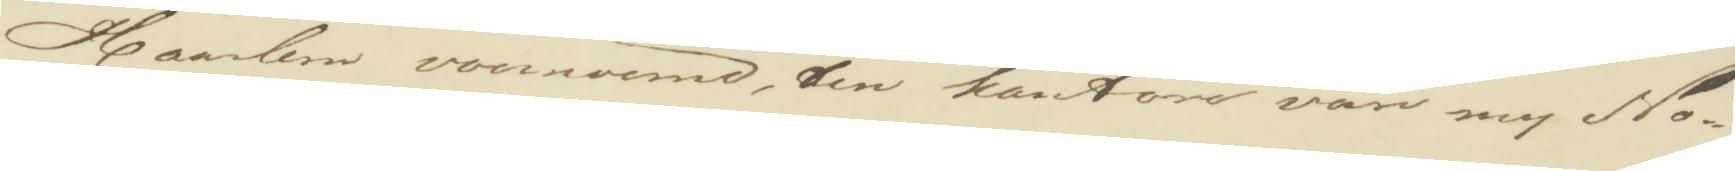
Haarlem voornoemd, ten kantore van my No„
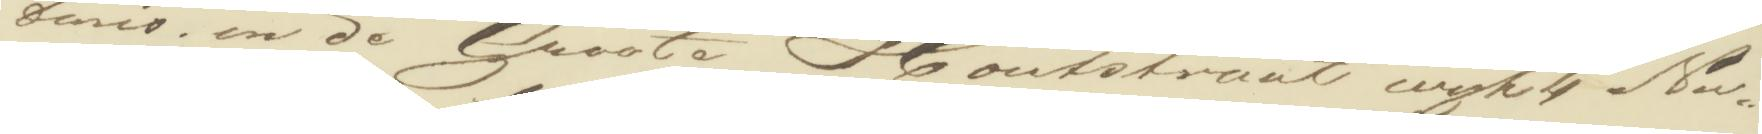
taris, in de Groote Houtstraat wyk 4 Nu„
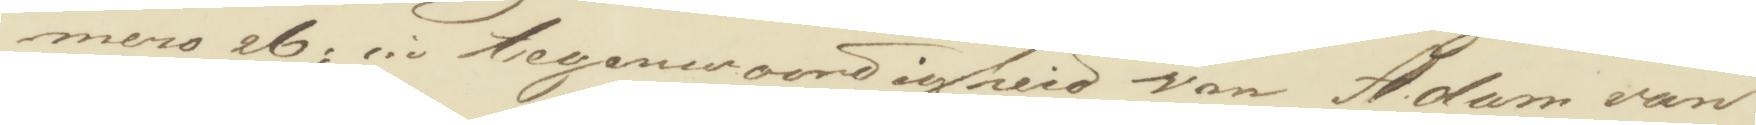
mero 26: in tegenwoordigheid van Adam van
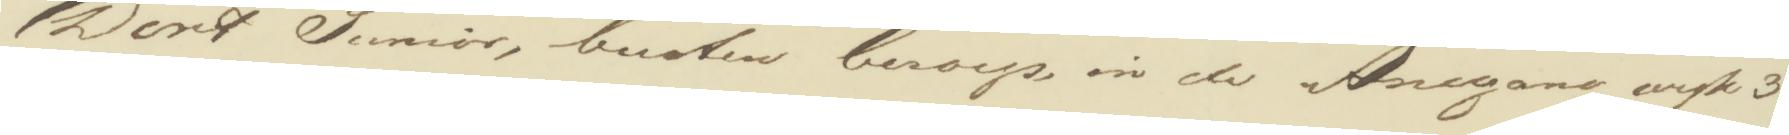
Dort Iunior, buiten beroep, in de Anegang wyk 3
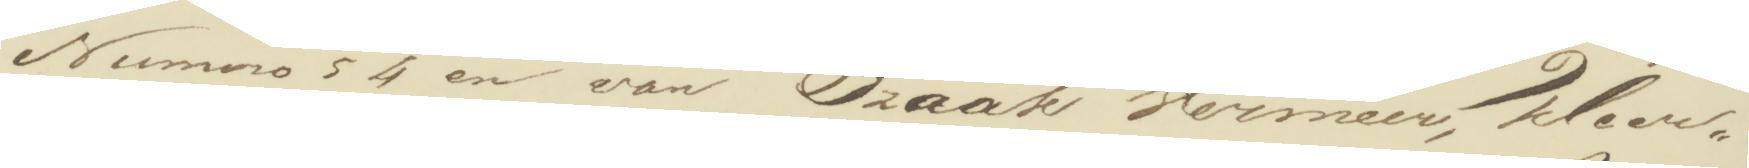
Numero 54 en van Izaak Vermeer, kleer„
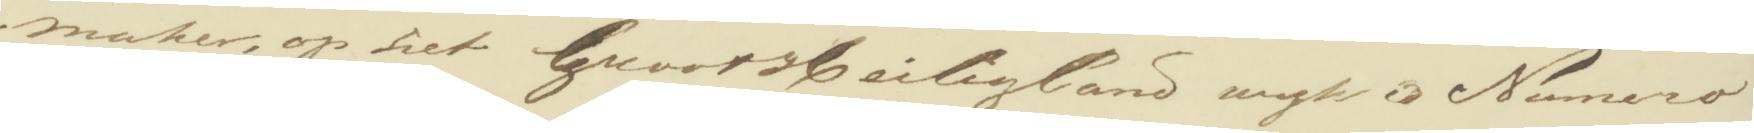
maker, op het Groot Heiligland wyk 3 Numero
